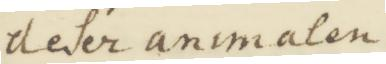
deser animalen
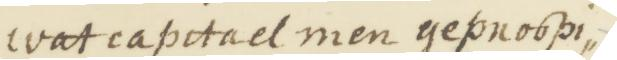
wat capitael men geprospi„
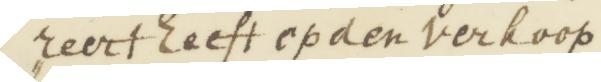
„reert heeft op den verkoop
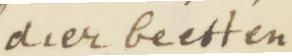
dier beesten
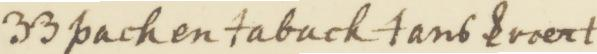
33 packen taback tans vervoert
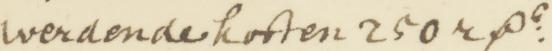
werdende kosten 250 rp:s
